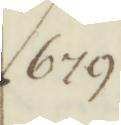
ƒ 679
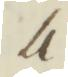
,, 4
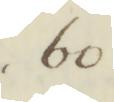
,, 60
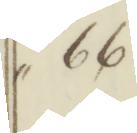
„ 66
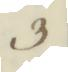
,, 3
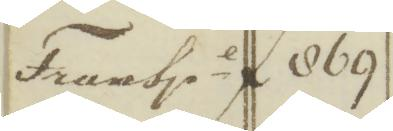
Transp-e ƒ 869
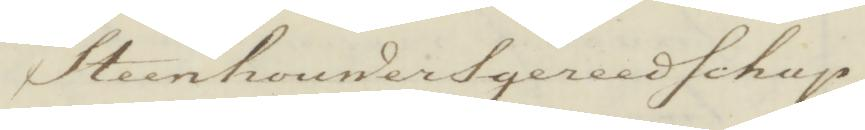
Steenhouwers gereedschap
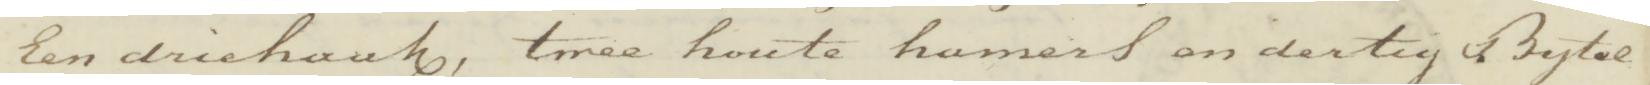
Een driehaak, twee houte hamers en dertig Bijtel
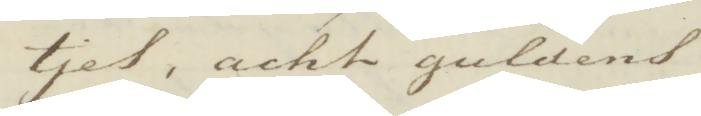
tjes, acht guldens
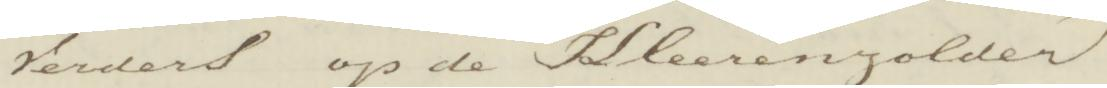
Verders op de Kleerenzolder
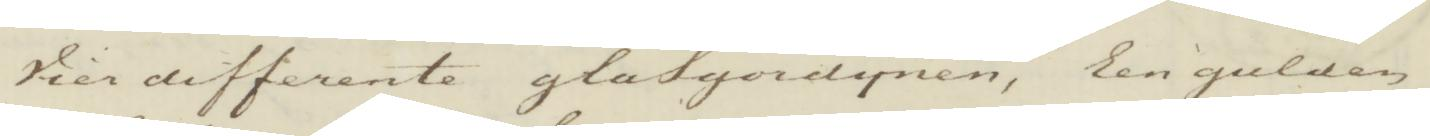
Vier differente glasgordynen, Een gulden
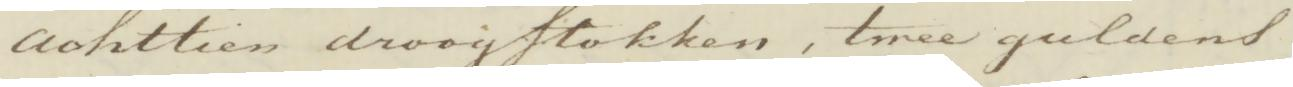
achttien droogstokken, twee guldens
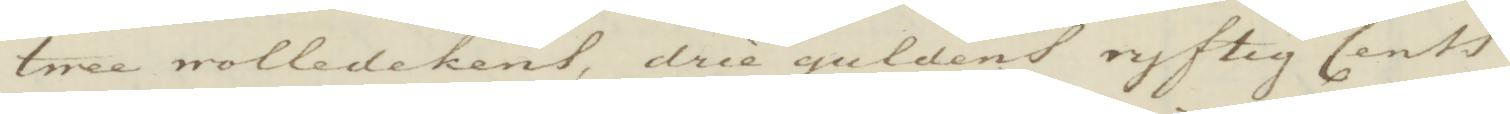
twee wolle dekens, drie guldens vyftig Cents
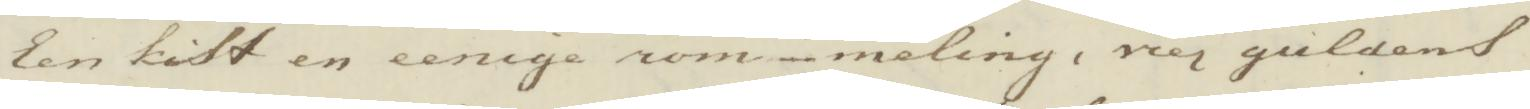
Een kist en eenige rom=meling, vier guldens
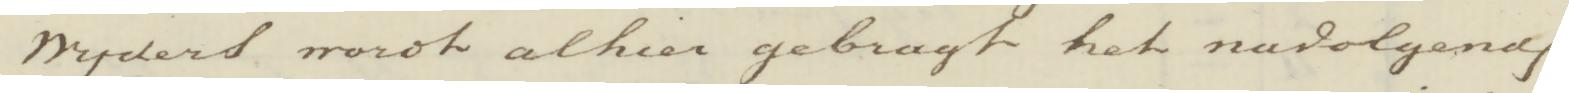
Wyders wordt alhier gebragt het navolgende
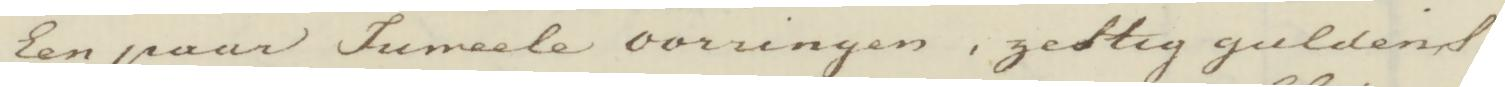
Een paar Iuweele oorringen, zestig guldens
